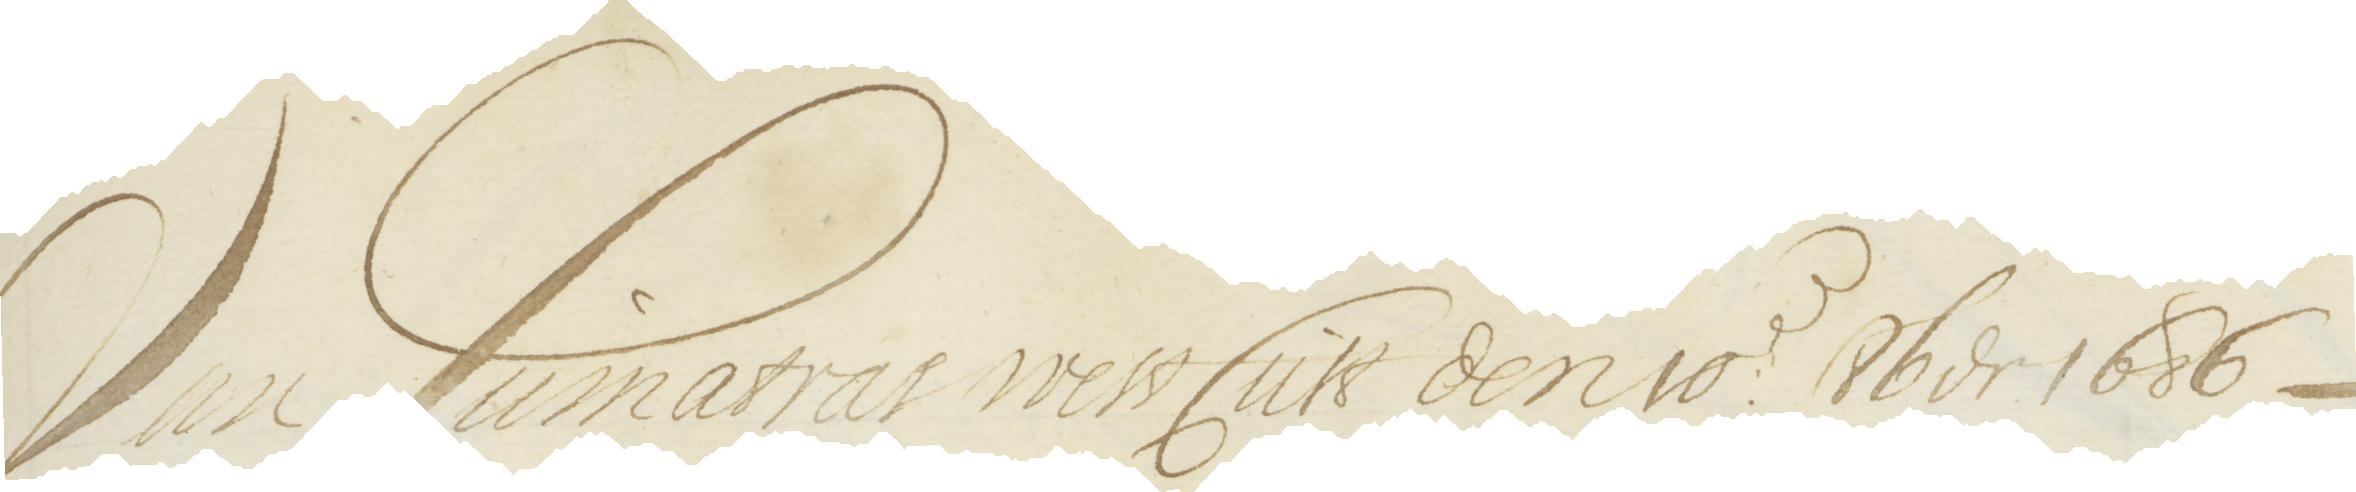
Van Sumarat west Cust den 10:e 8ber 1686
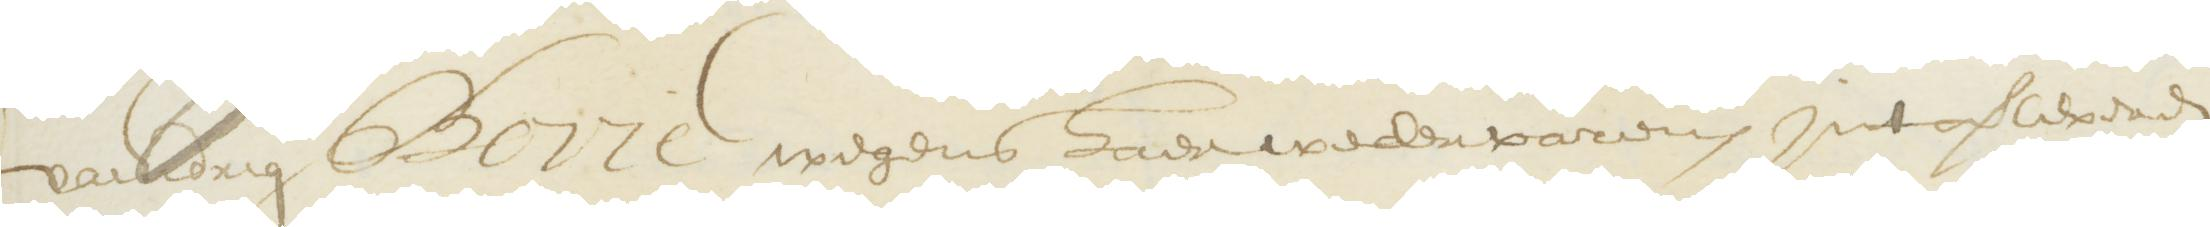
vaendrig Bovie wegens haer wedervaren, Jnt overleveren
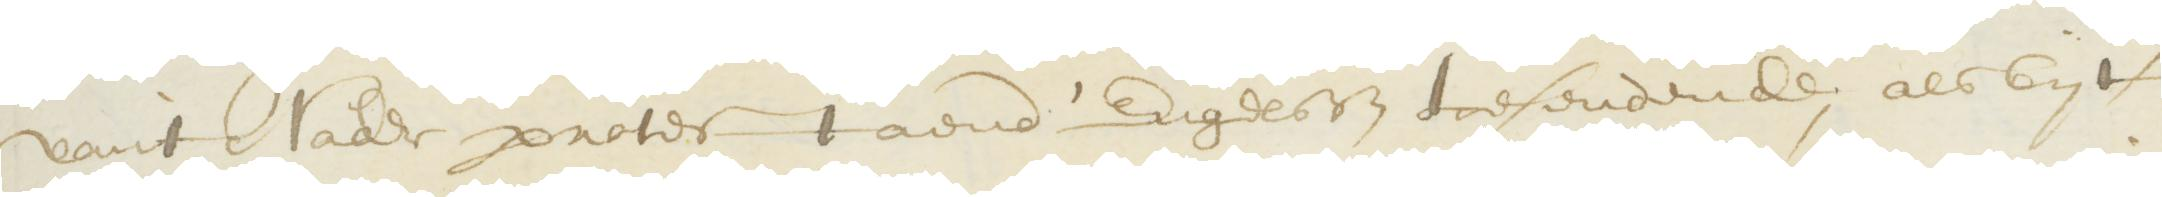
van’t Nader protest aend 'Engelssen toesendende, als bijt
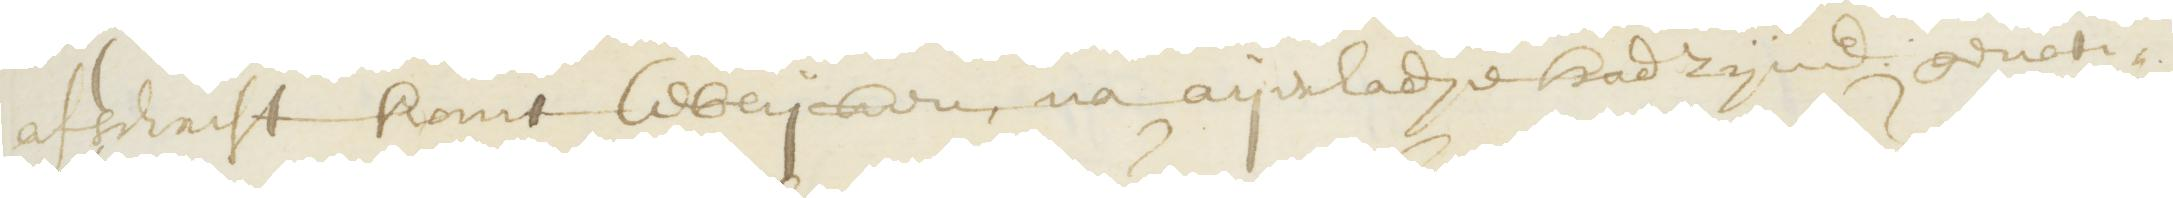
afschrift komt teblijcken, na aijerhadje had zijnde genoti„
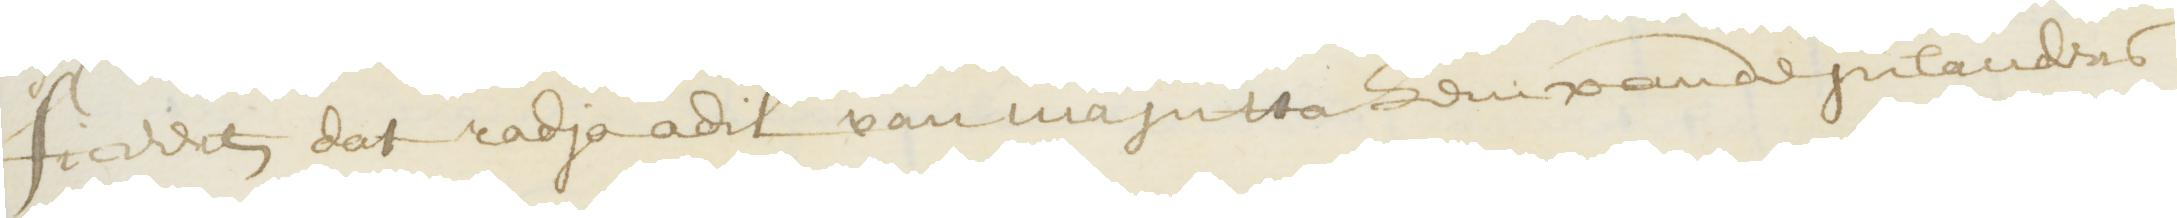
ficeert dat radja adil van majutta hemvande jnlanders
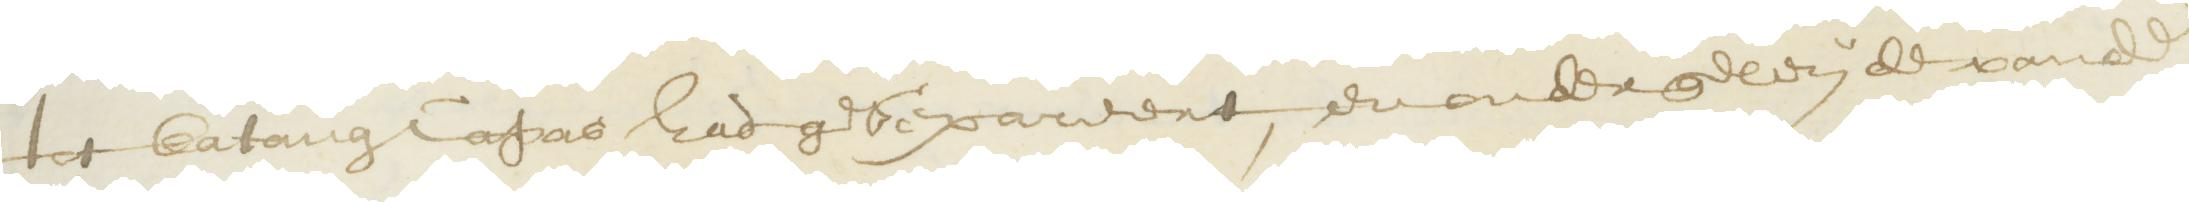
tot batang Capas had gesepareert, en ondergeleijde vande
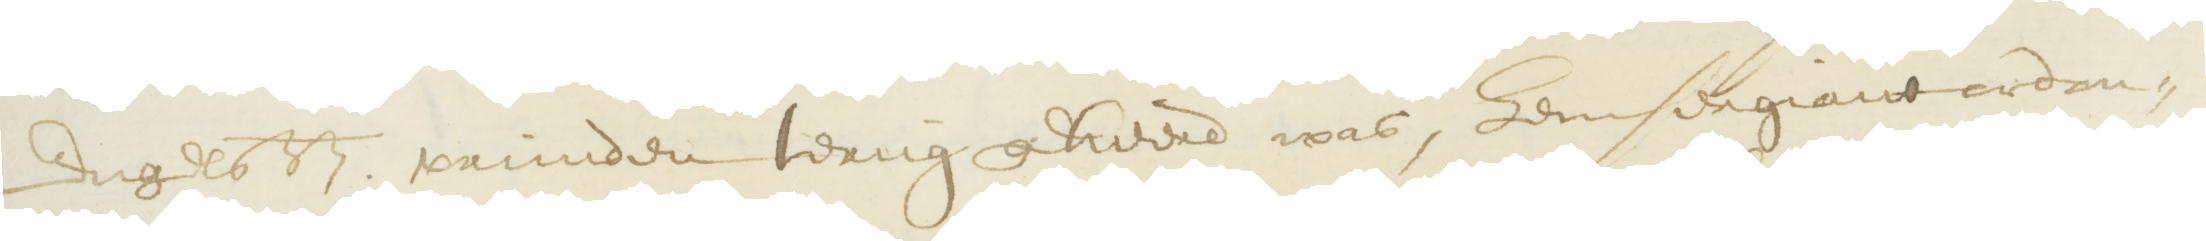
Engelsse vrunden terug gekeerd was, hem sergiant ordon„
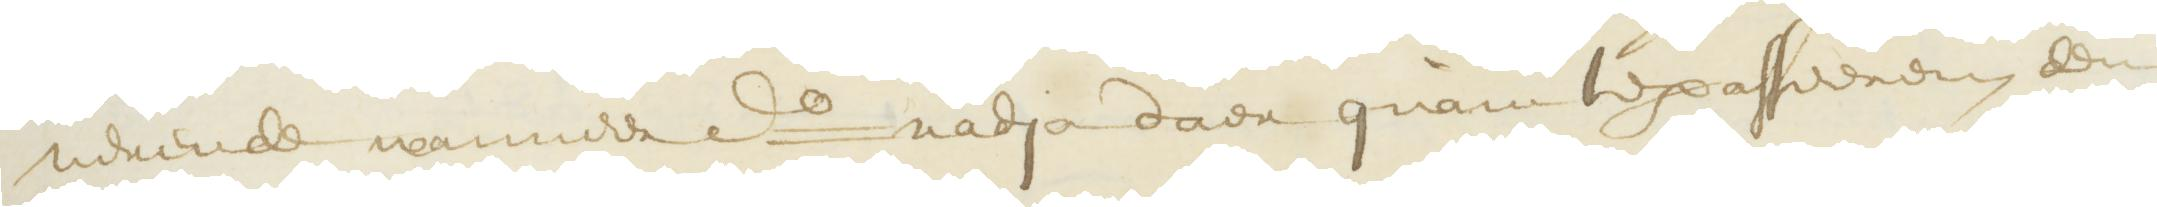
nerende wanneer d=o radja daer quam tepasseeren, den
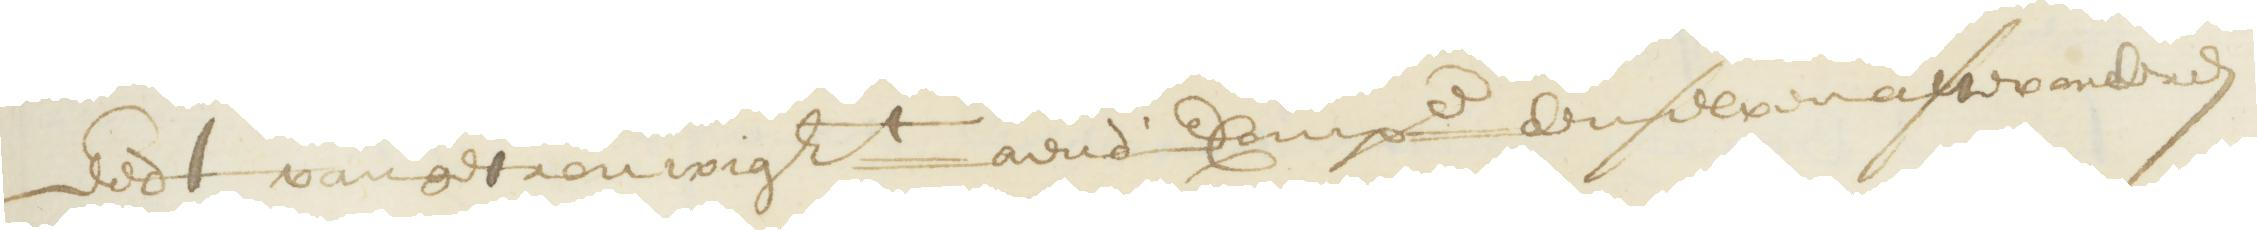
Eedt van getrouwigh=t aend’ EComp=e denselven aftevorderen
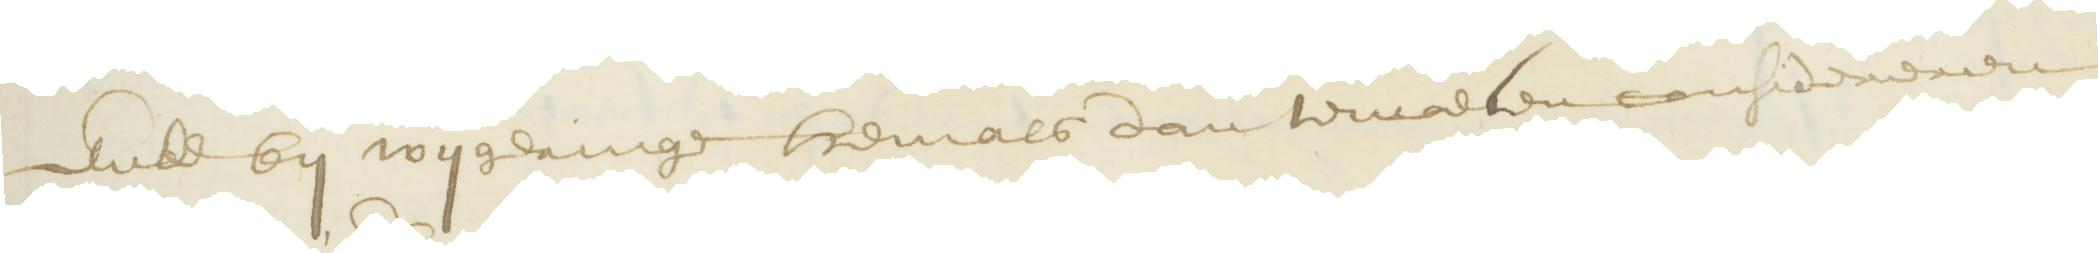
ende bij wijgeringe hemals dan temoeten confidereren
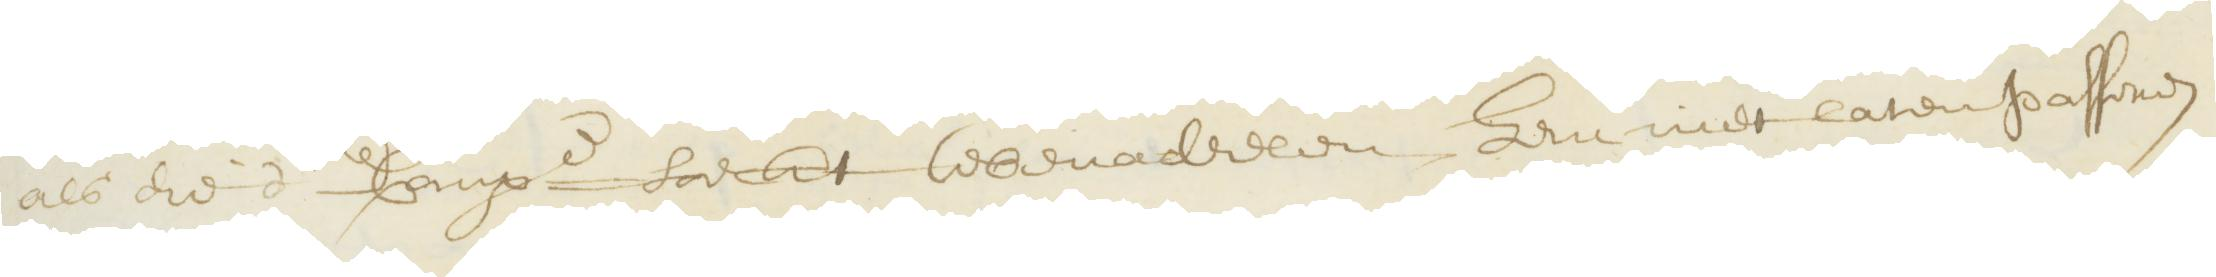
als die d’ EComp=e soeckt tebenadeelen, hem niet laten passeren
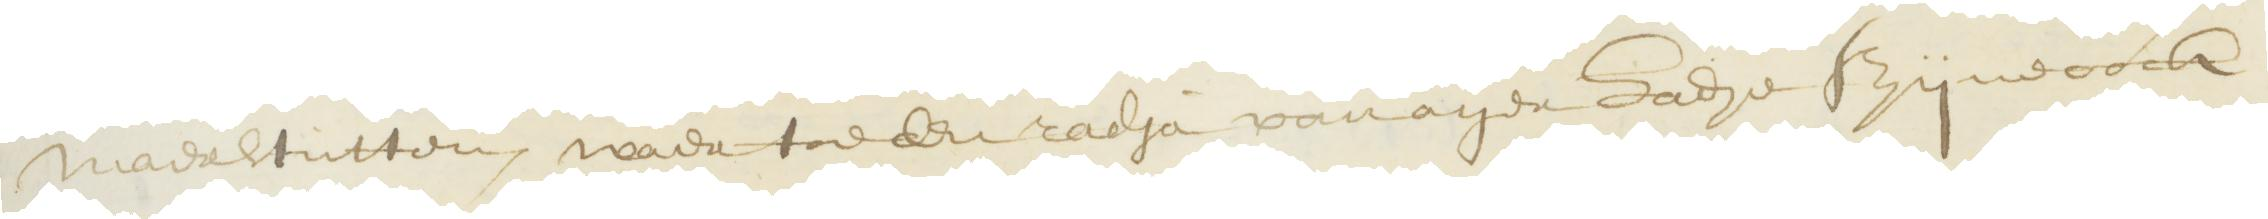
maerstutten, waer toe den radja van aijer Hadje tZijneoock
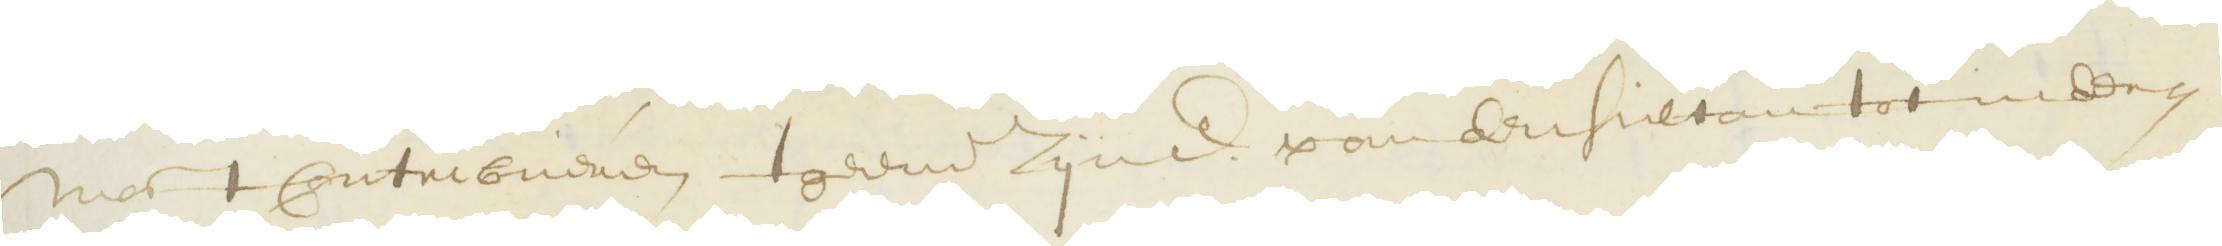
most contribueren tgeene Zijn E: van den sultan tot inder
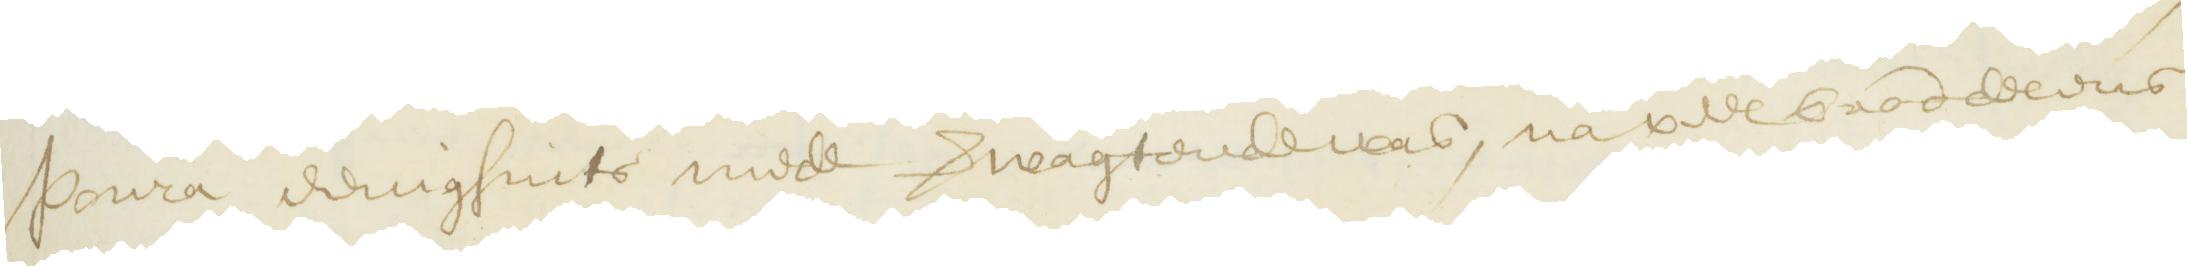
Poura eenigsints mede verwagtende was, na veel broddelens
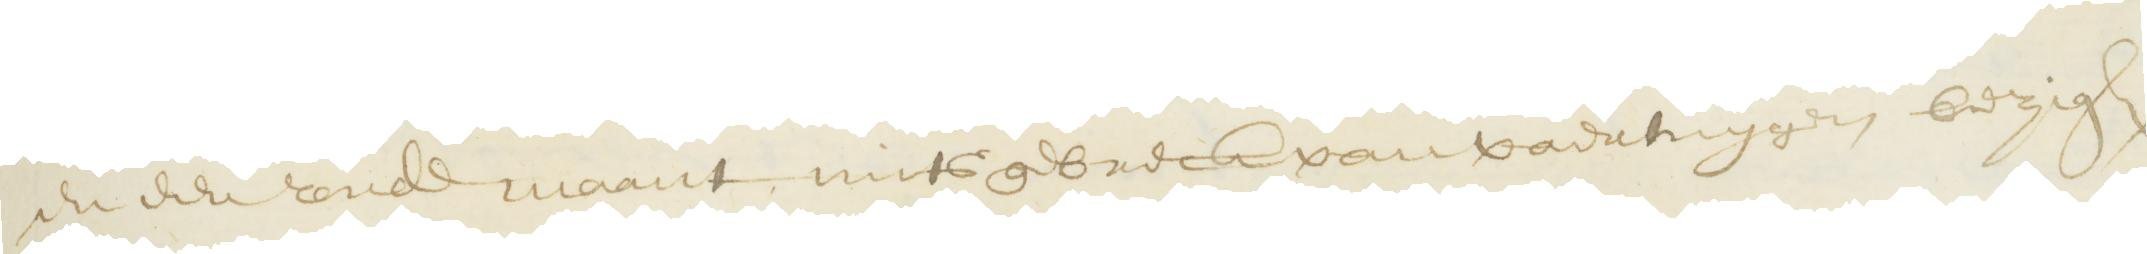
en een ronde maant, mits gebreck van vaertuijgen bezigh
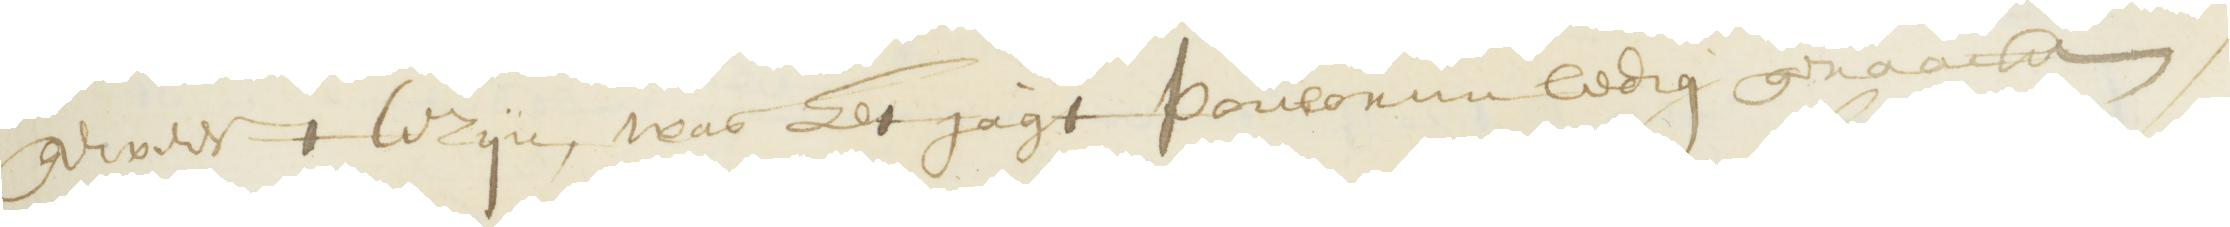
geweest tezijn, was het jagt poulorun ledig geraackt,
